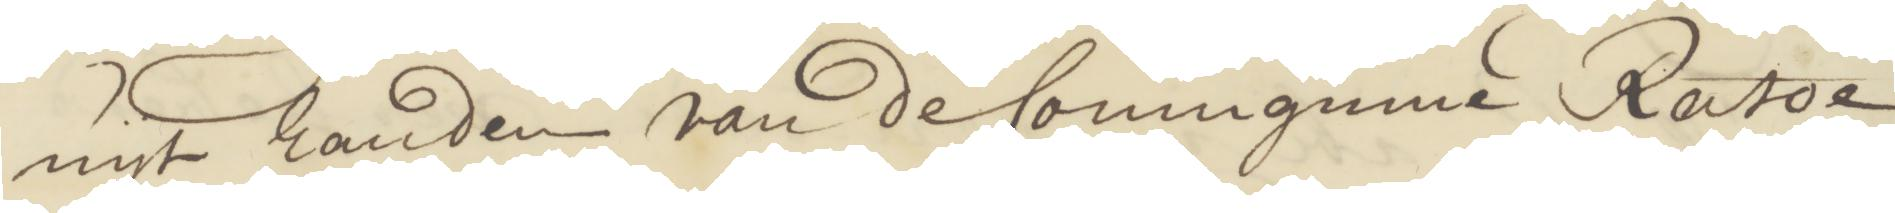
uijt handen van de Coninginne Ratoe
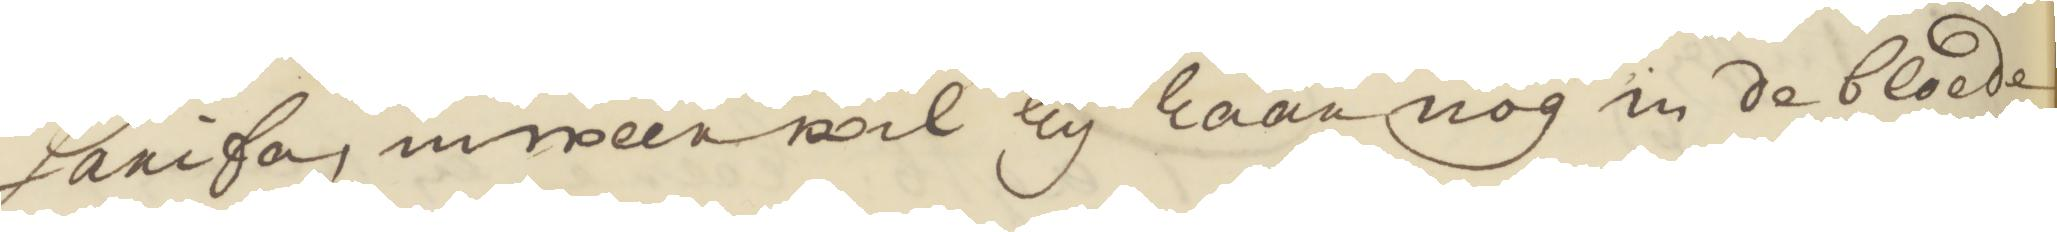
Sarifa, in weer wil hij haar nog in de bloede
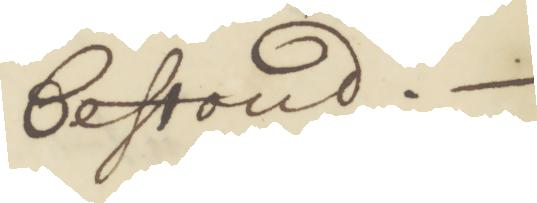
bestond. —
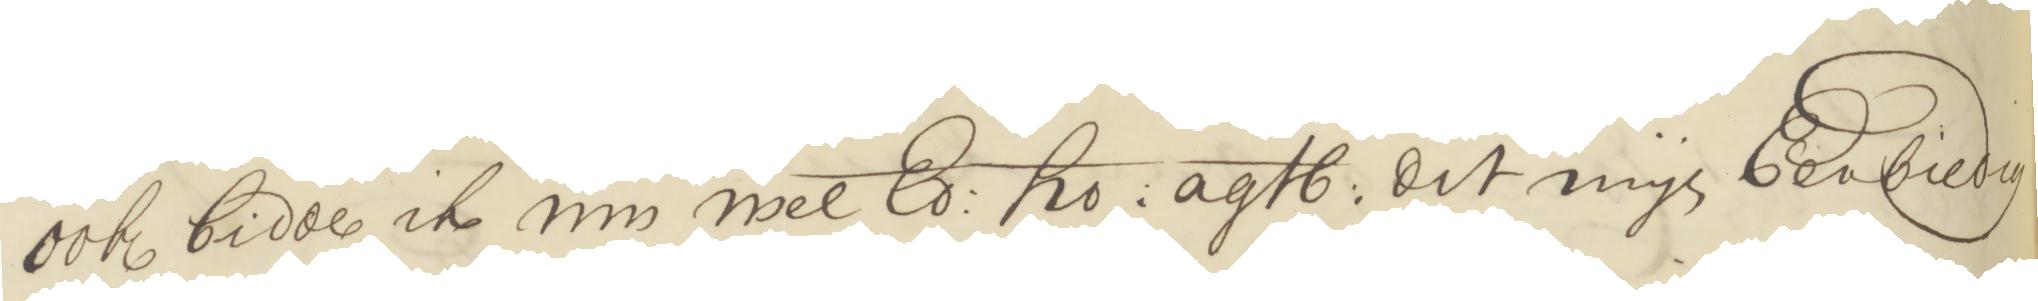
ook bidde ik uw wel Ed: ho: agtb: dit mijn Eerbiedig
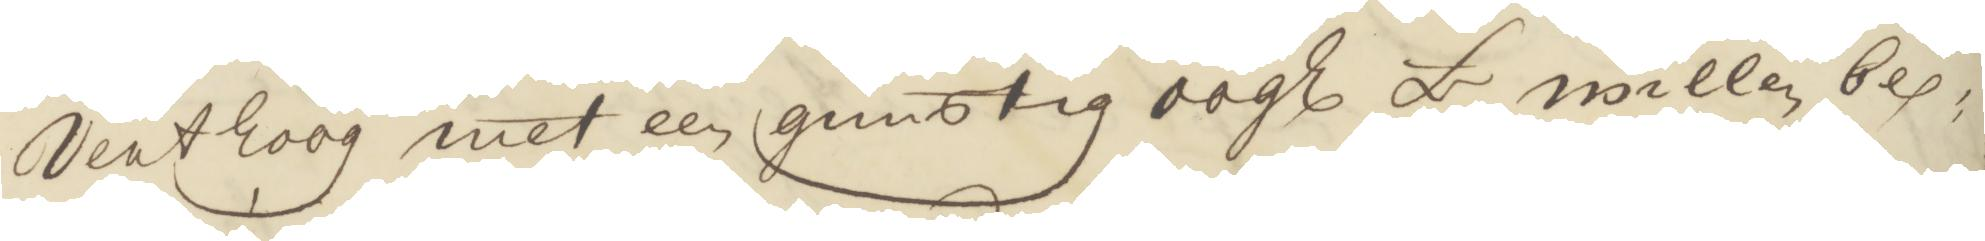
verthoog met een gunstig oogh te willen be:
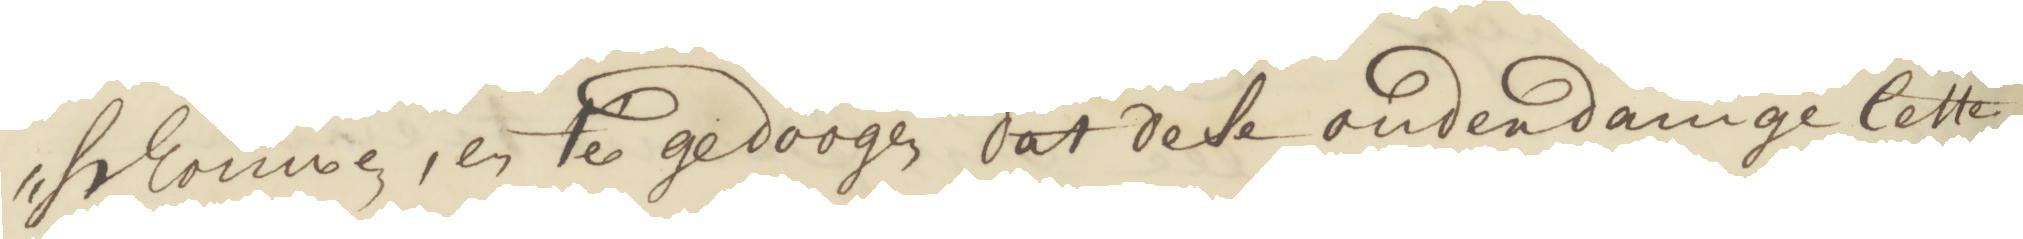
schouwen en te gedoogen dat dese onderdanige lette
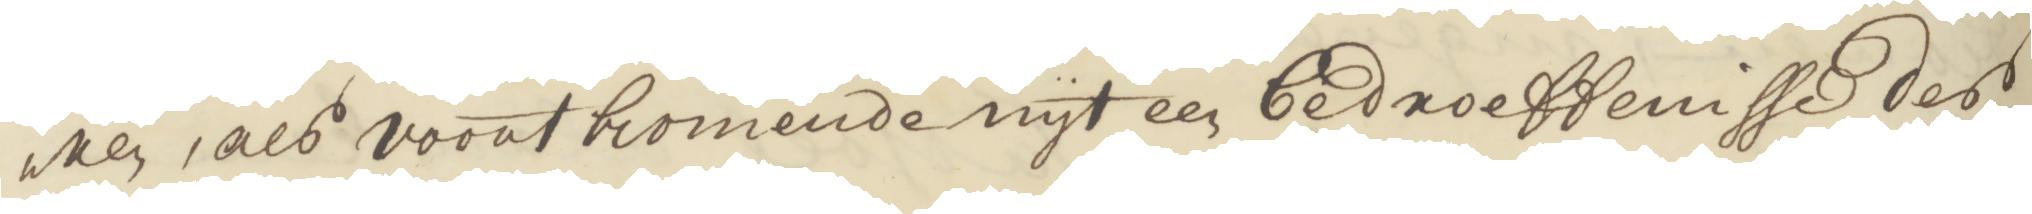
ren, als voort komende uijt een bedroeffenisse des
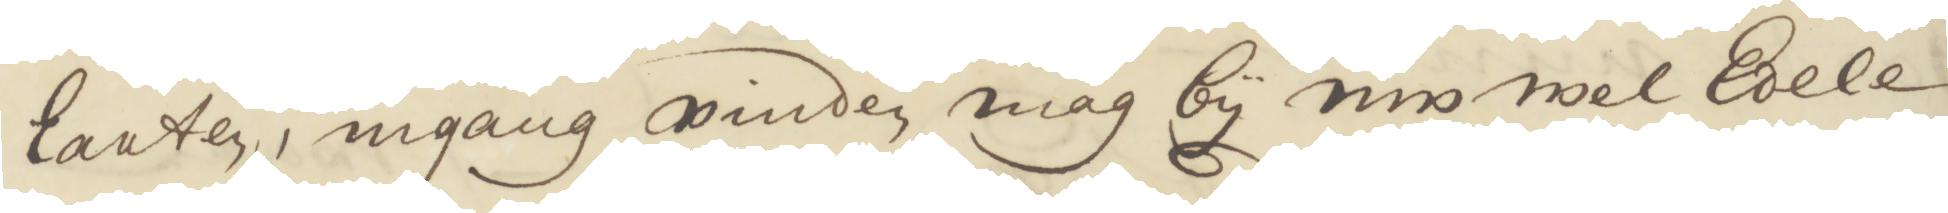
harten, ingang vinden mag bij uw wel Edele
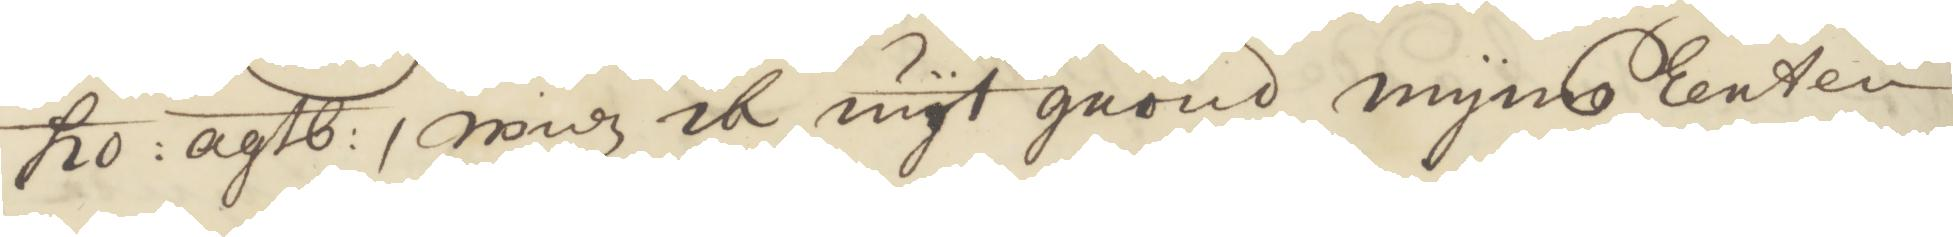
ho: agtb:, wien ik uijt grond mijns herten
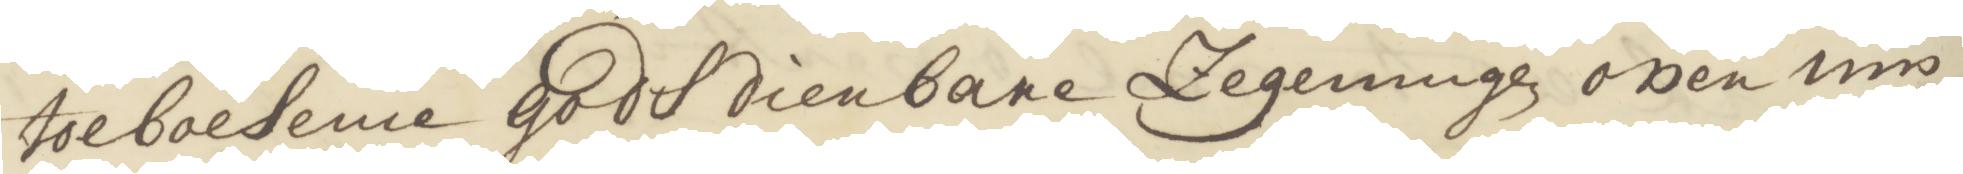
toeboeseme gods dierbare zegeningen over uw
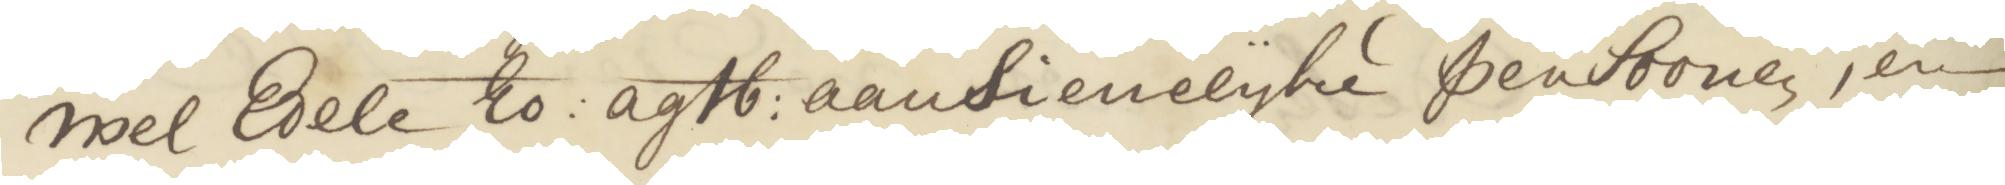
wel Edele ho: agtb: aansienelijke persoonen, en
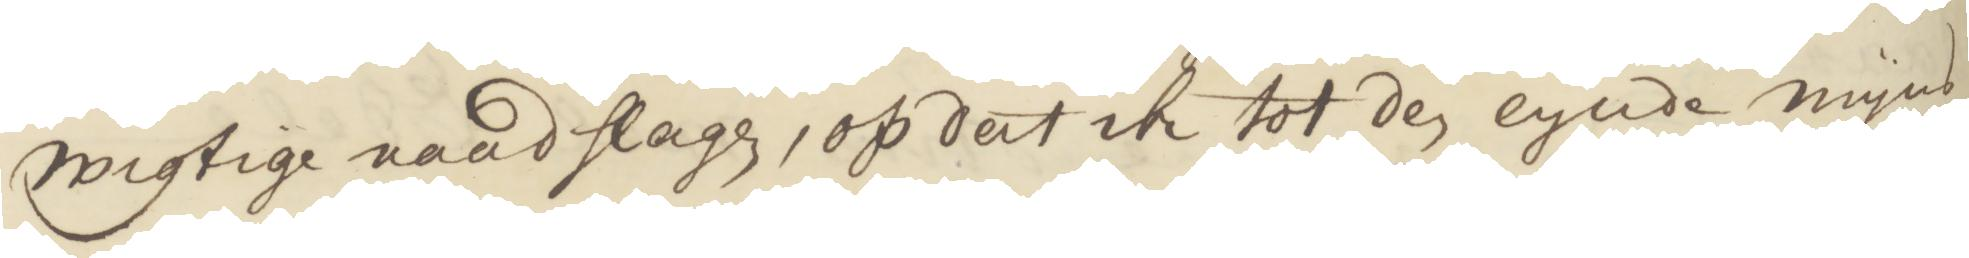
wigtige raadslagen, op dat ik tot den eijnde mijns
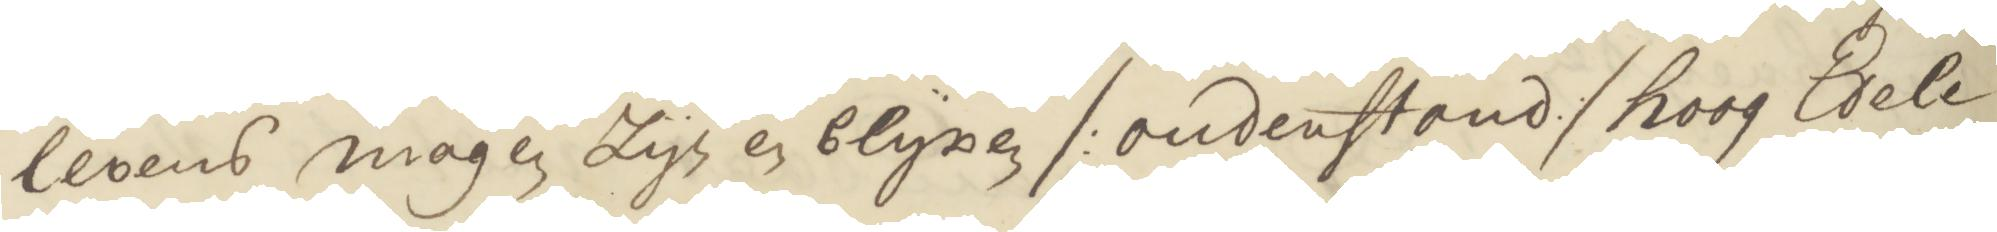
levens mag en zijn en blijven /:onderstond:/ hoog Edele
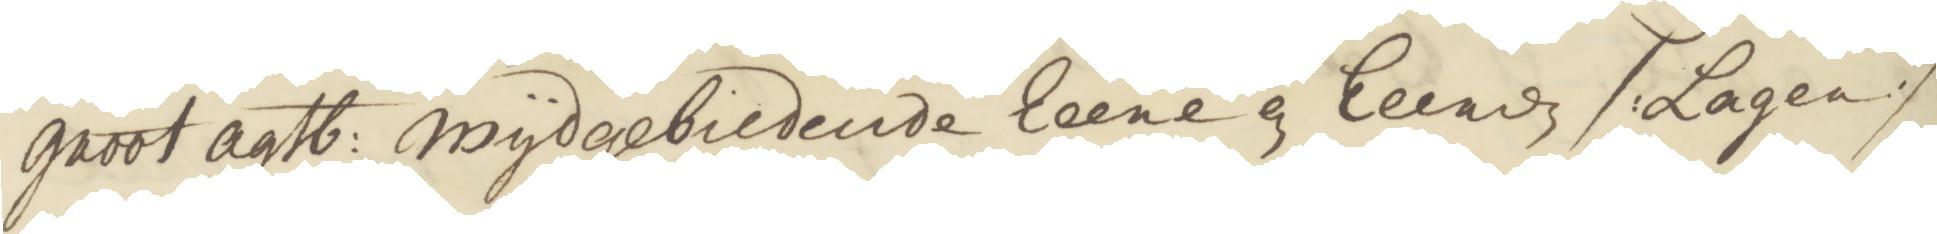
groot agtb: wijdgebiedende heere en heeren /:lager:/
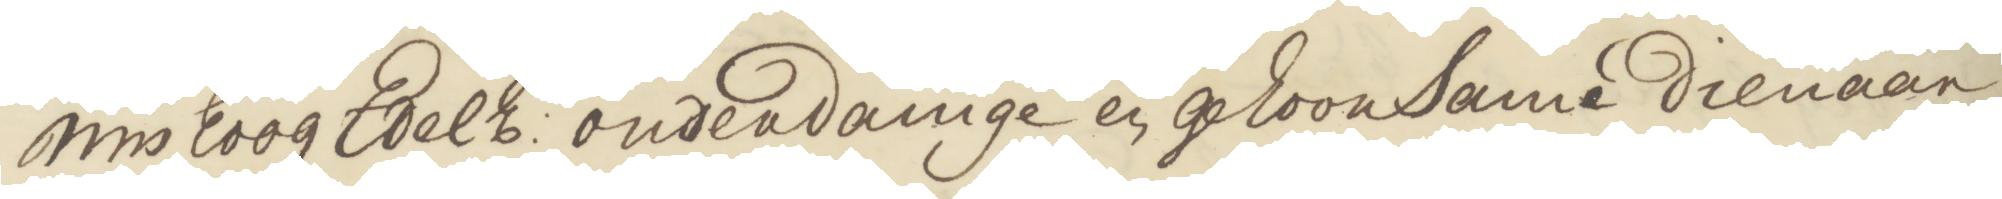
uw hoog Edelh:s onderdanige en gehoorsame dienaar
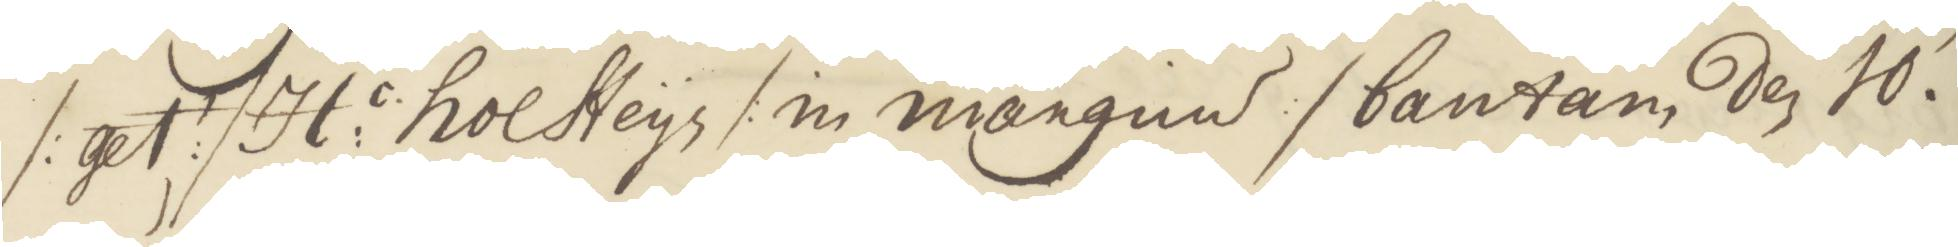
/:get:'/ H:c holsteijn /:in margine:/ bantam den 10.'
